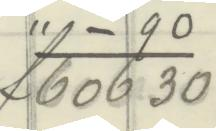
ƒ 606 30
